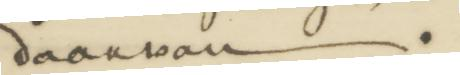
daarvan.
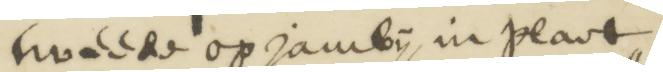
tweede op Jambij in plaet„
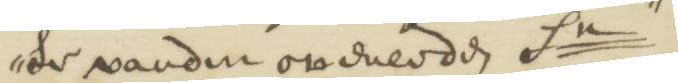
„se van den overleden s=r
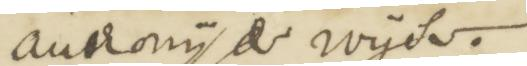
anthonij de wijse.
